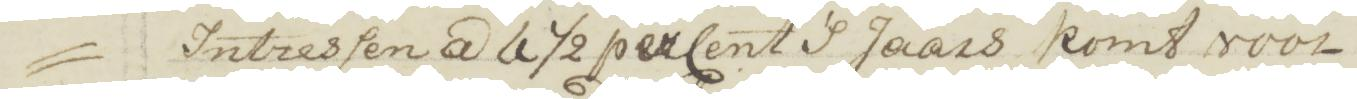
= Intressen @ 4½ percent 's Jaars komt voor
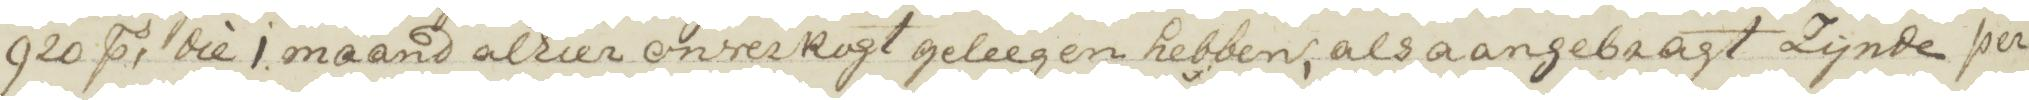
920 p„s die 1 maand alhier onverkogt geleegen hebben, als aangebragt zijnde per
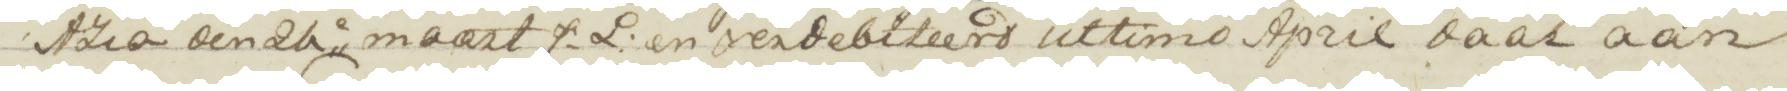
Azia den 24„e maart J: L: en verdebiteerd ultimo April daar aan
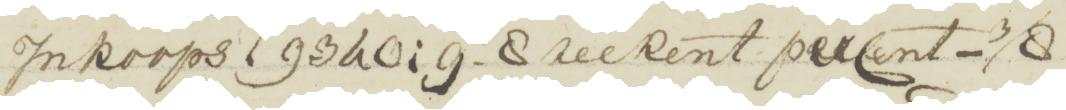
Jnkoops ƒ9340:9:8 reekent percent – 3/8
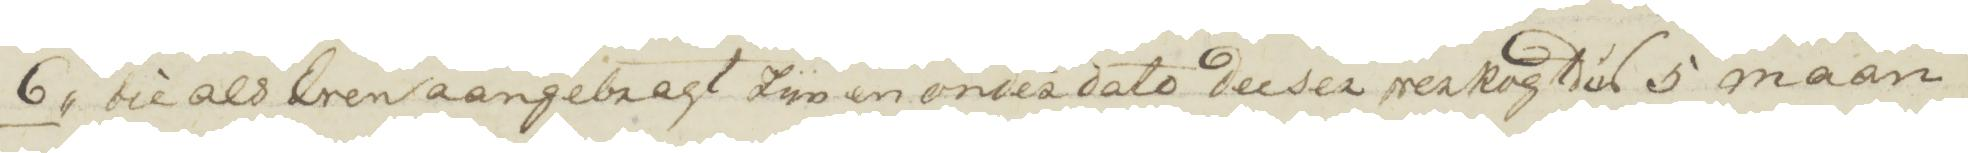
6 „ die als even aangebragt zijn en onder dato deeser verkogt dus 5 maan
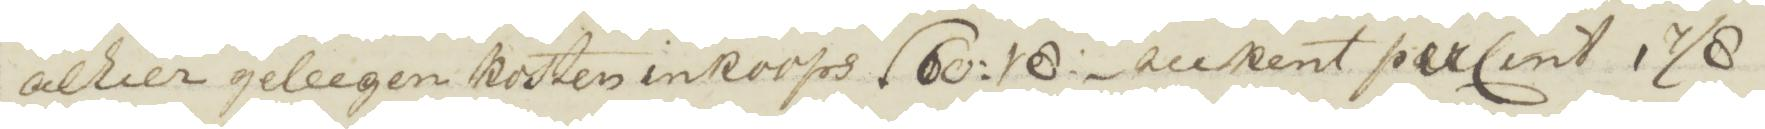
alhier geleegen kosten inkoops ƒ60:18:— reekent percent 1 7/8
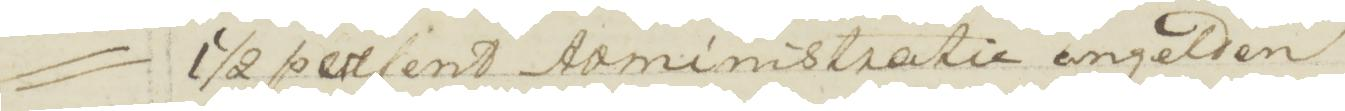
= 1½ percent Administratie ongelden
